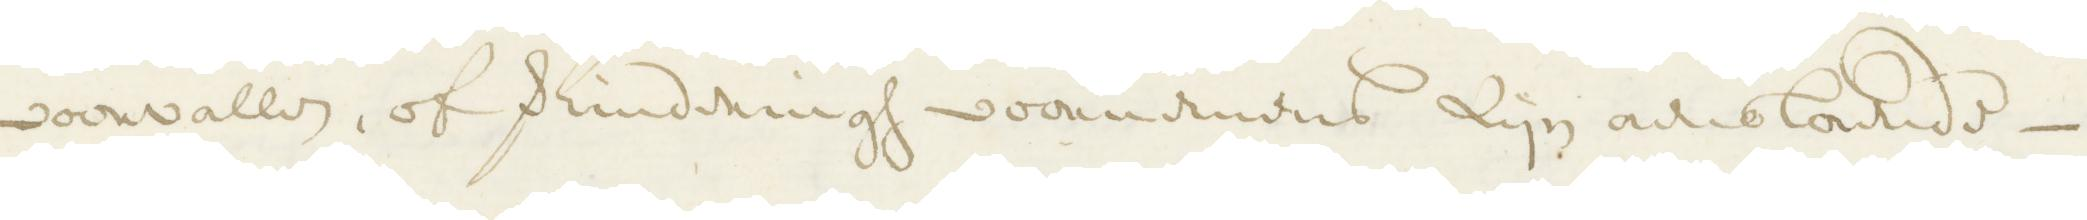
voorvallen, of verhinderingh voornemens zijn aenstaende —
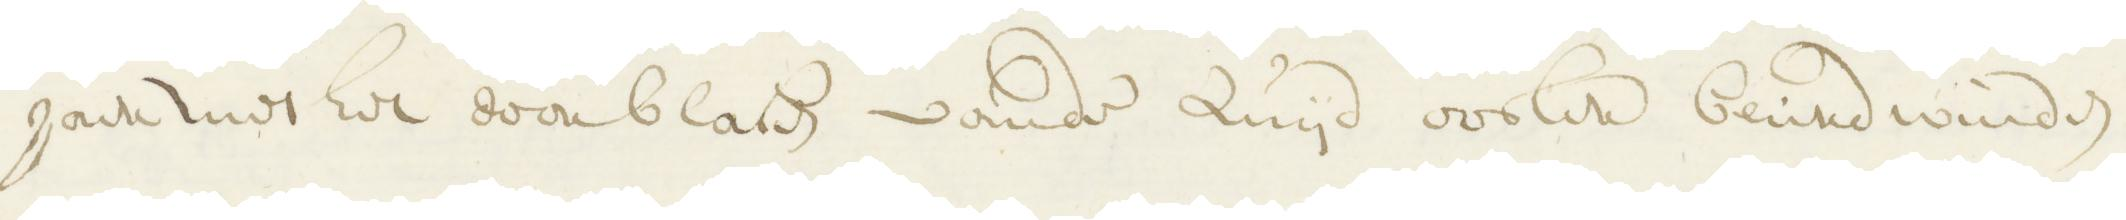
jaer met het door blasen vande zuijd ooster beurdwinden
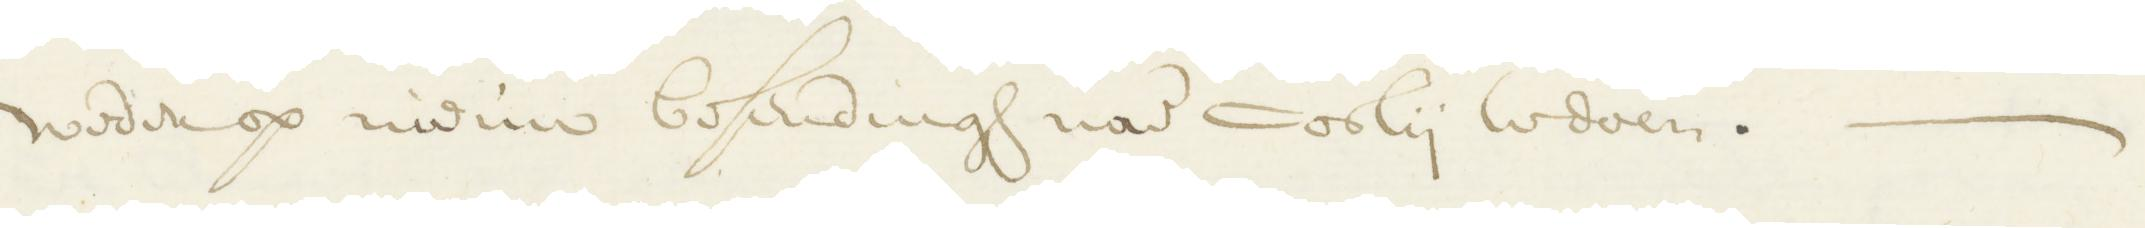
weder op nieuw besendingh nae costij te doen. —
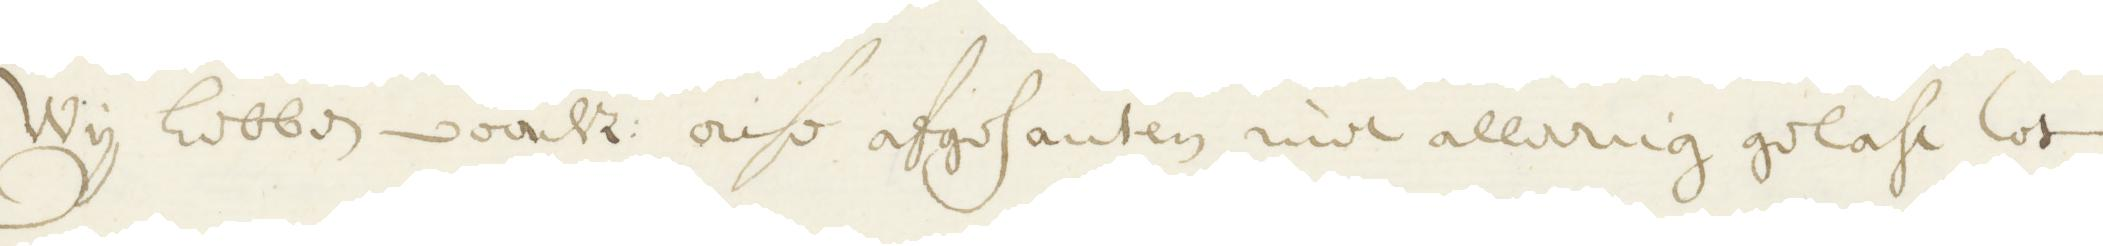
Wij hebben voorsz: onse afgesanten niet alleenig gelast tot
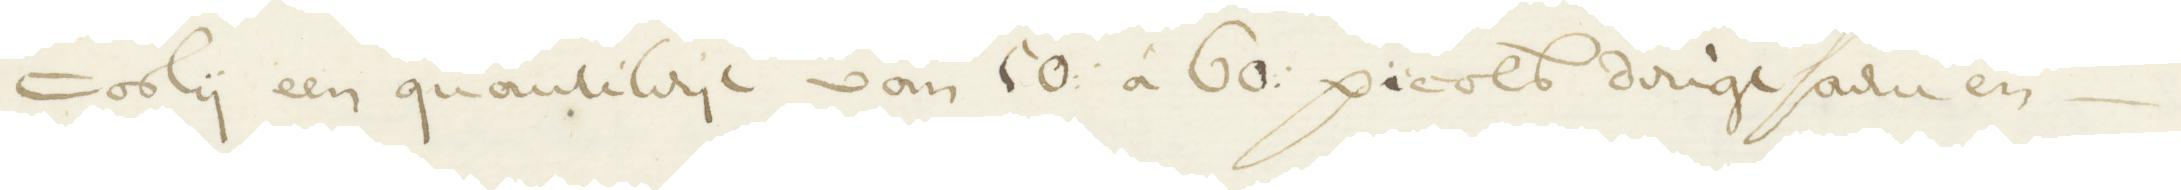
costij een quantiteijt van 50: â 60: picols deugtsaem en —
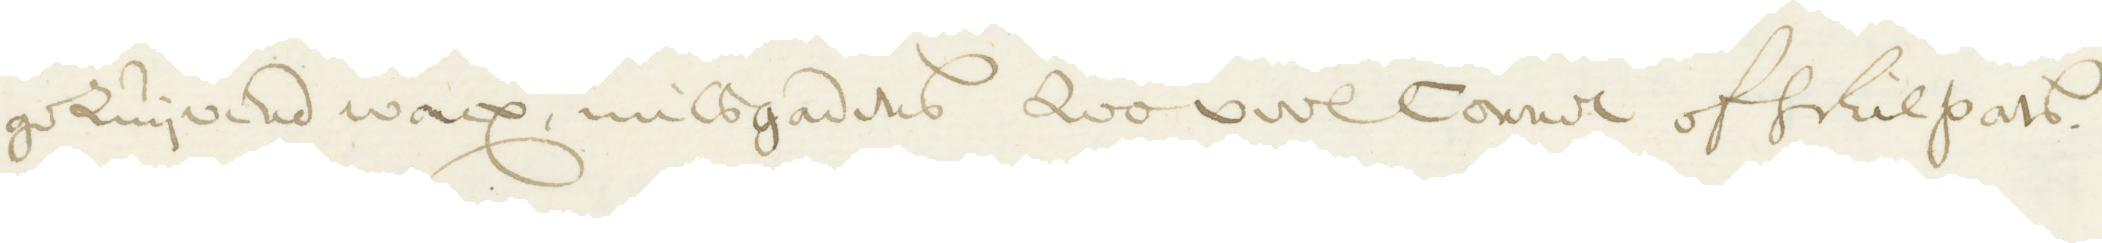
gezuijverd wacx, mitsgaders zoo veel corret of schilpats.
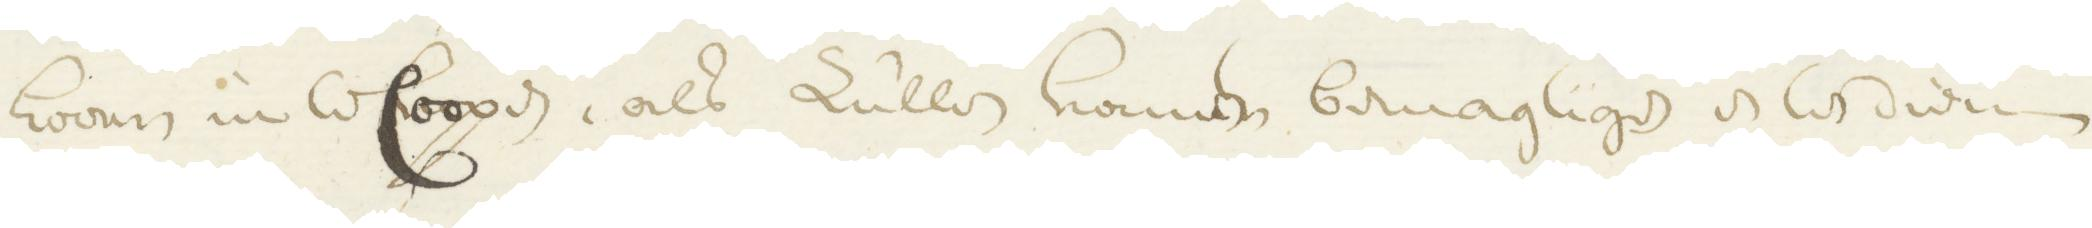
hoorn in te Coopen, als zullen konnen bemagtigen en ten dien
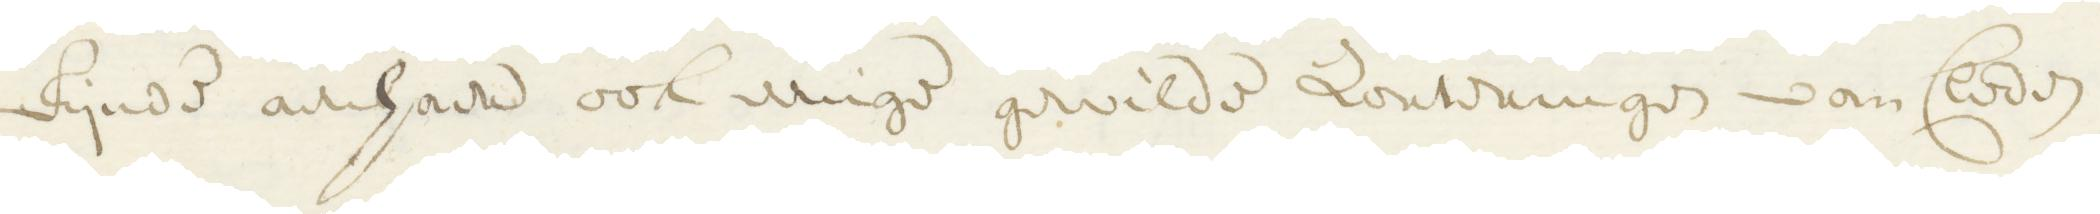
Eijnde aen haere ook eenige gewilde zorteringen van Cleden
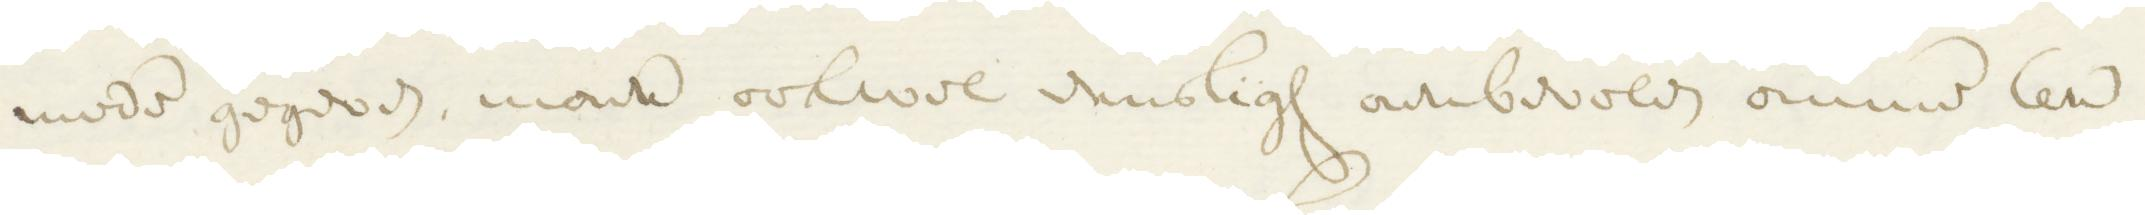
mede gegeven, maer ookwel ernstigh aenbevolen omme ter
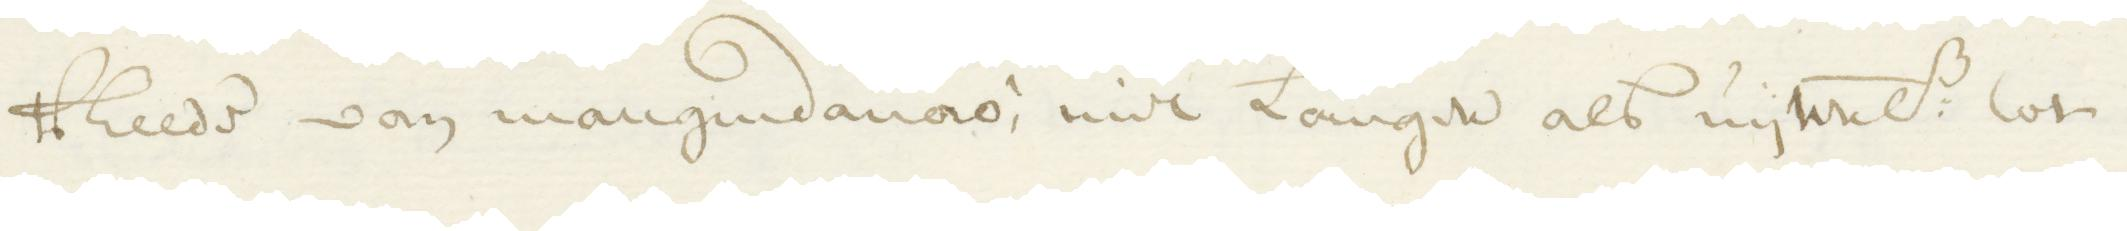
rheede van mangindanao; niet langer als uijterlijk tot
